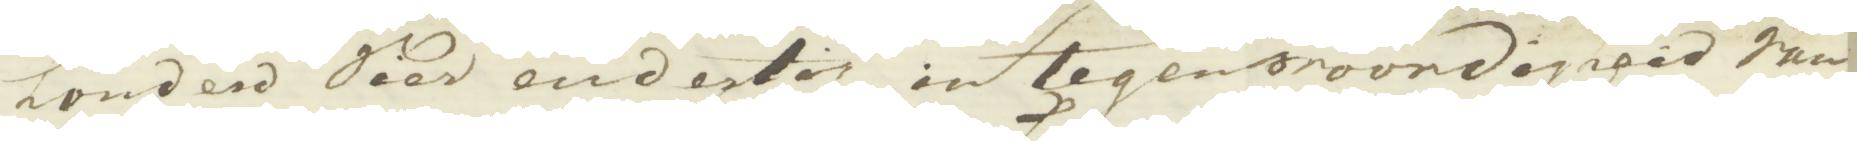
honderd Vier en dertig, in tegenwoordigheid van
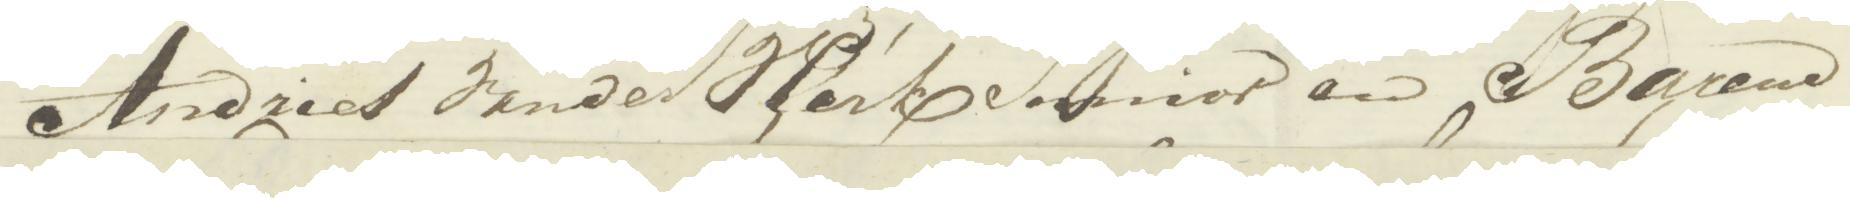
Andries van der Vlerk Junior en Barend
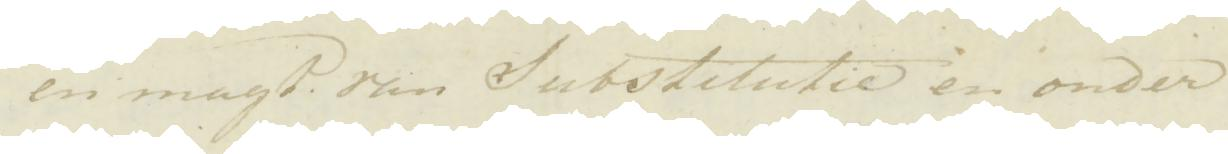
en magt van substitutie en onder
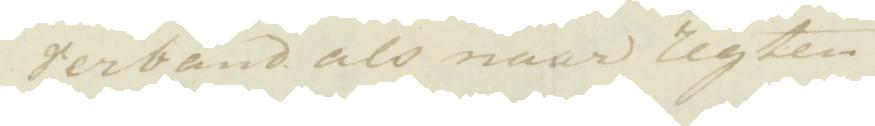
verband als naar regten.
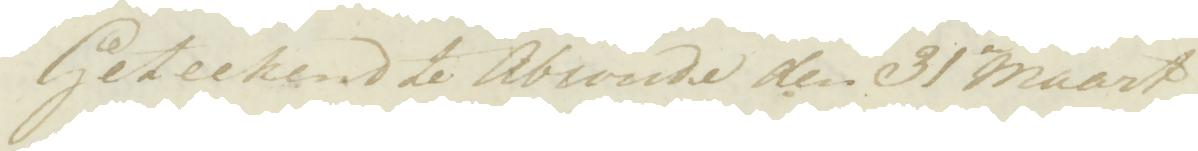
Geteekend te Abcoude den 31 Maart
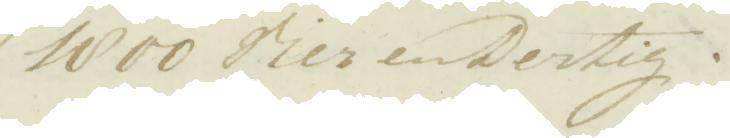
1800 Vier en Dertig.
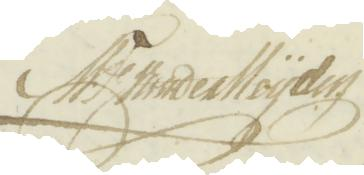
MF van der Mijden
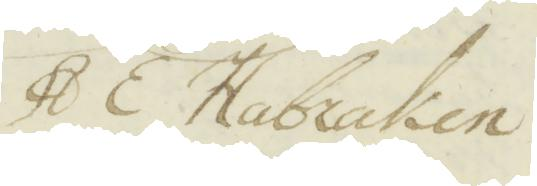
A E Habraken
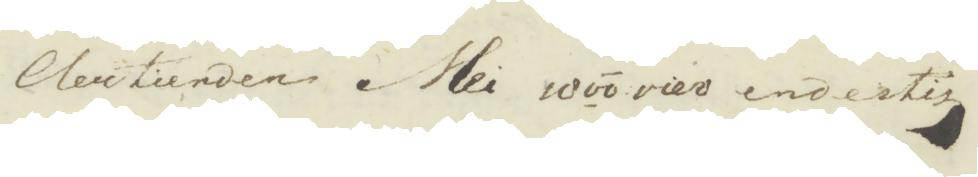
dertienden Mei 1800: vier en dertig
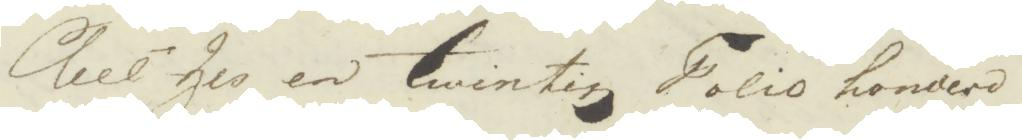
Deel zes en twintig Folio honderd
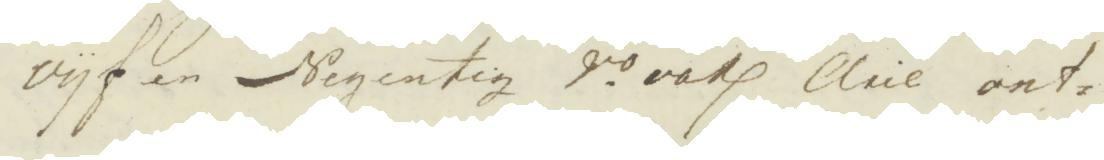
vijf en Negentig V.o vak drie ont„
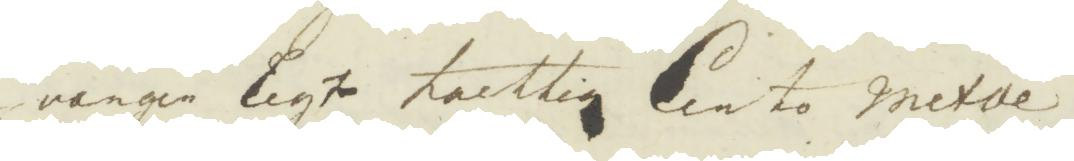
„vangen regt tachttig Cents met de
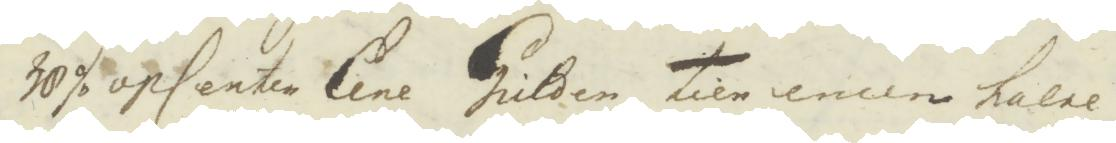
38% opcenten Eene Gulden tien en een halve
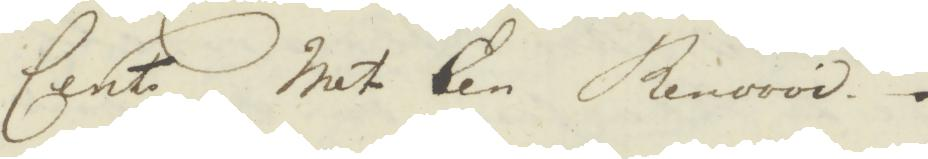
Cents met Een Renvooi.
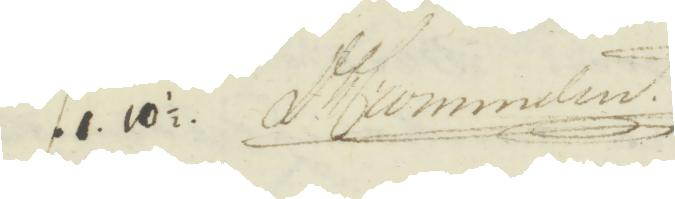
ƒ1. 10½. DF Crommelin.
